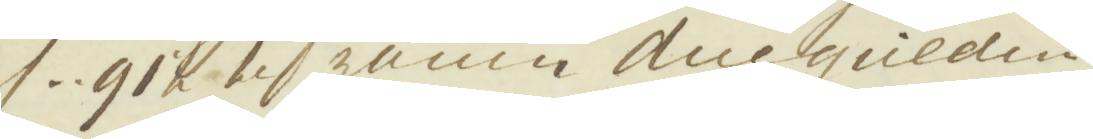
ƒ-.91½ te zamen drie gulden
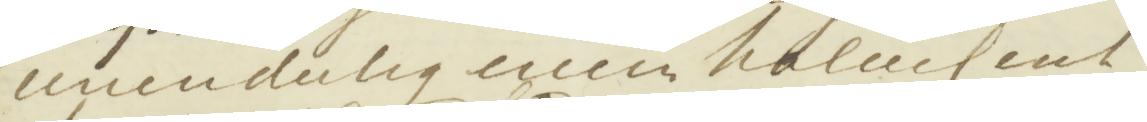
eenen dertig en een halve Cent
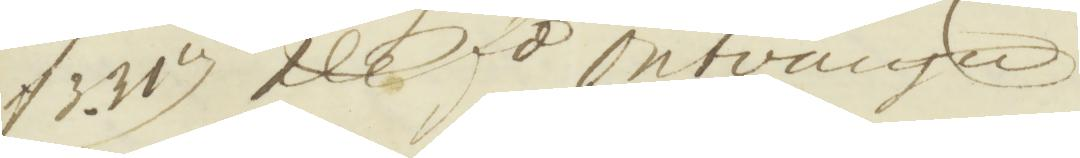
ƒ3.31½ De rd ontvangen
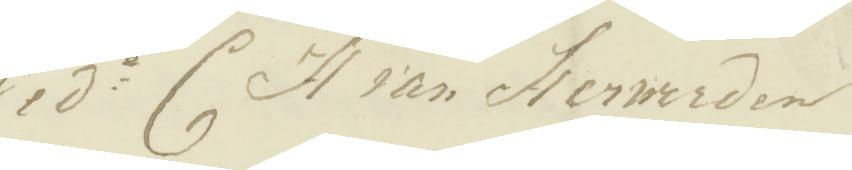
Wed=e C H van Herwerden
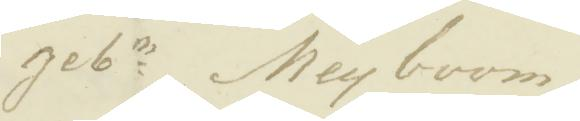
geb=n Meyboom
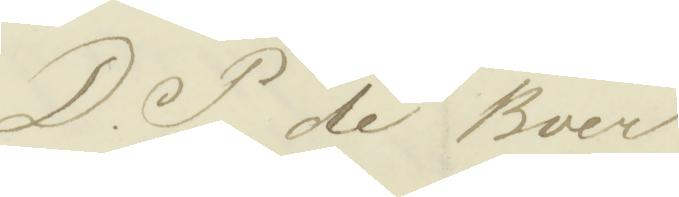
D. P. de Boer
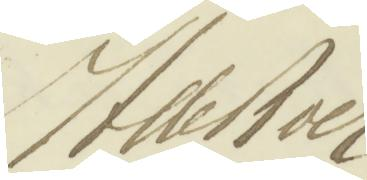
H de Boer
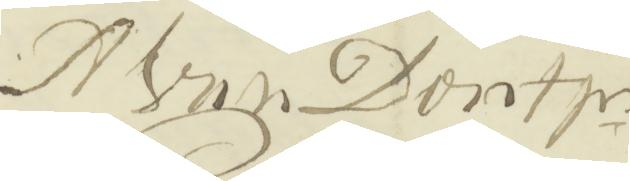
A Van Dort j„r
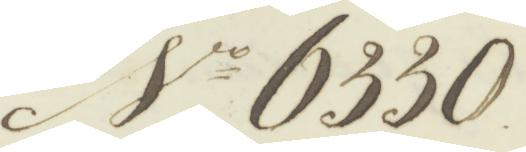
N=o 6330
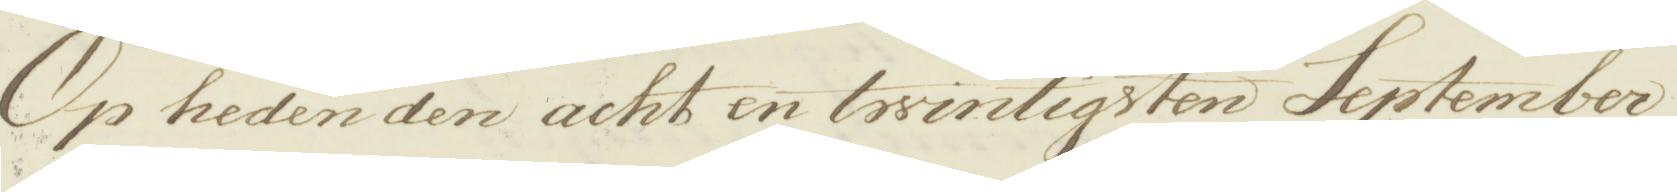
Op heden den acht en twintigsten September
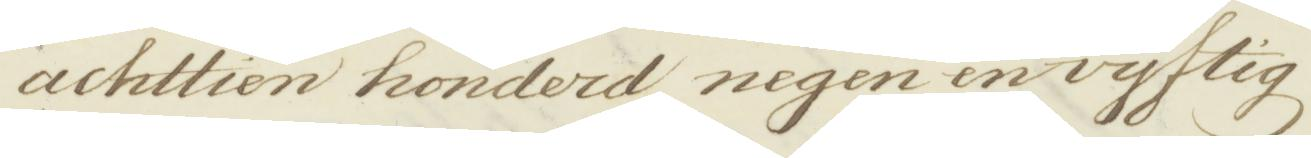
achttien honderd negen en vijftig
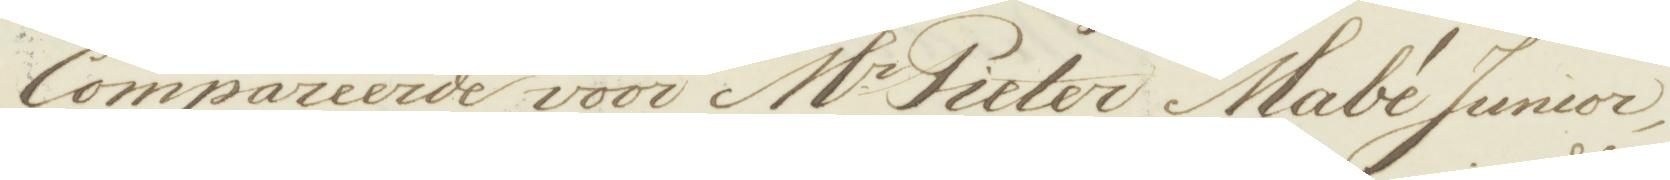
Compareerde voor M.r Pieter Mabé Junior,
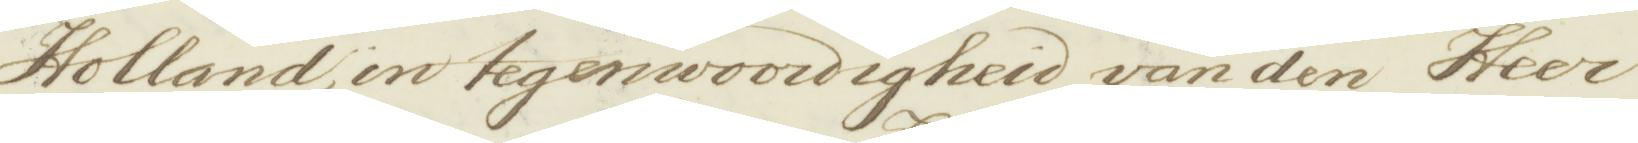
Holland, in tegenwoordigheid van den Heer
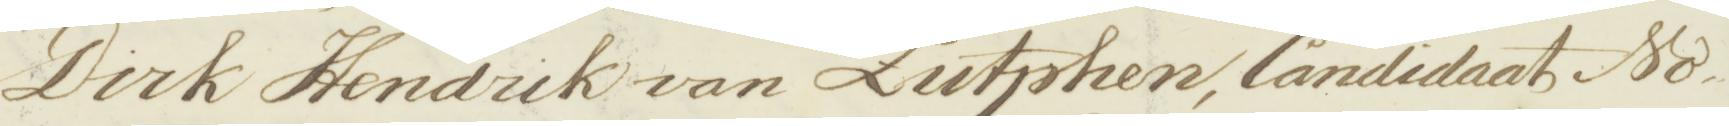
Dirk Hendrik van Zutphen, Candidaat No„
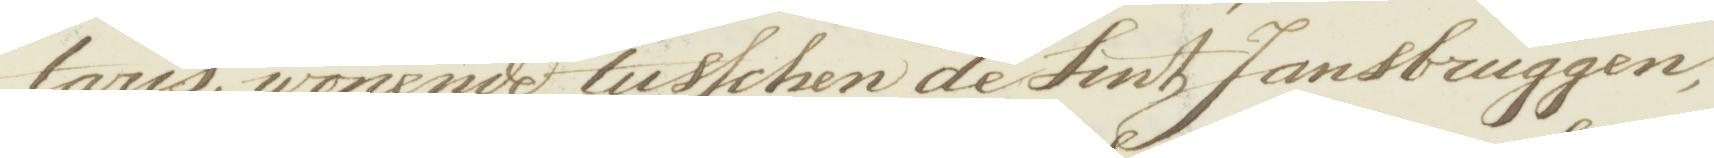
taris, wonende tusschen de Sint Jansbruggen,
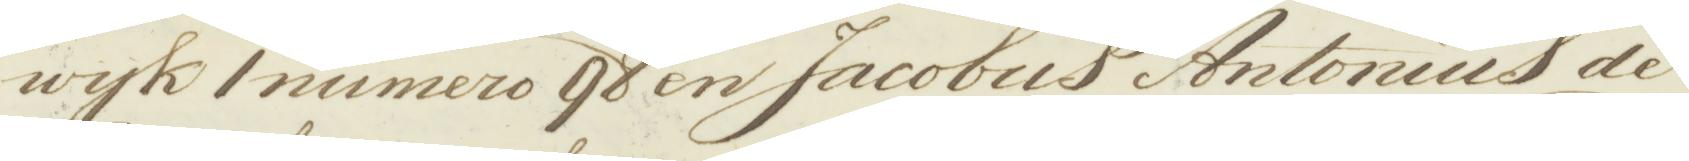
wijk 1 numero 98 en Jacobus Antonius de
